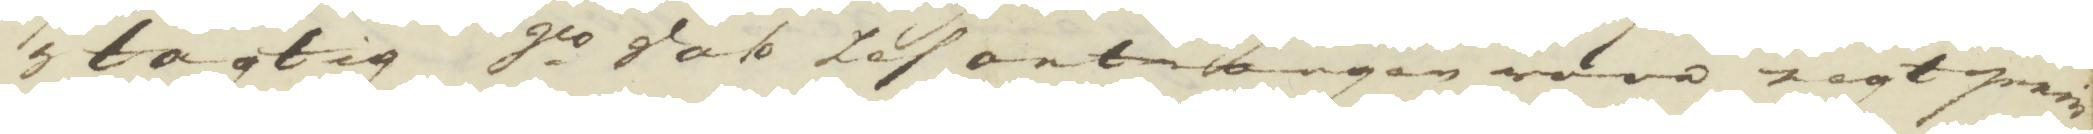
& tagtig N=o vak Zes ontfangen voor regt pan
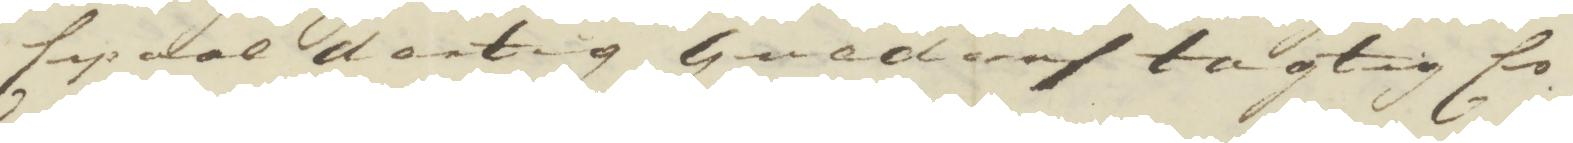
sp zal dertig Guldens tagtig Co.
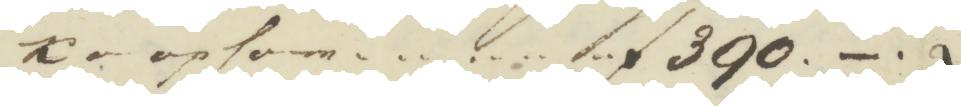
Koopsom . . . . . . . . . . . ƒ390. – .
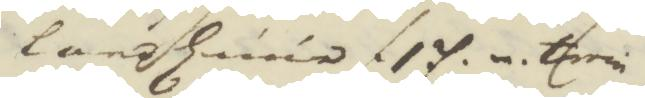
lang Geuven ƒ17. -. Grij
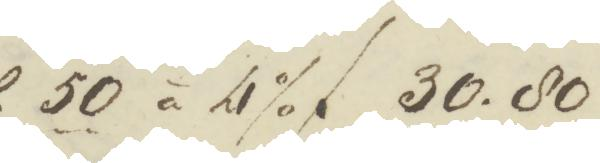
50 à 4 5/8 ƒ 30.80
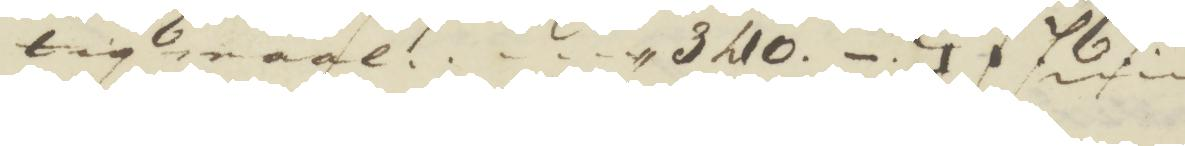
tig maal. . . „340. —.5 ƒ76
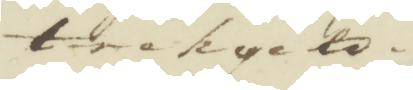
trekgeld
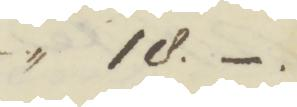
„ 18.—.
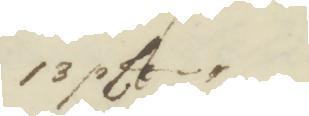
13 pct - „
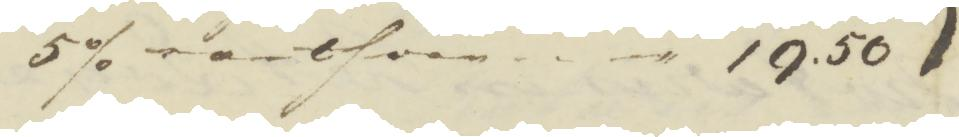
5% rantsoen . . -„ 19.50
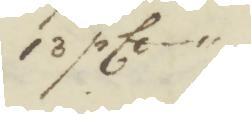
13 pco -
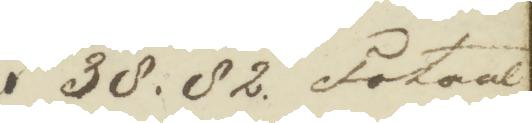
ƒ 38. 82. Totaal
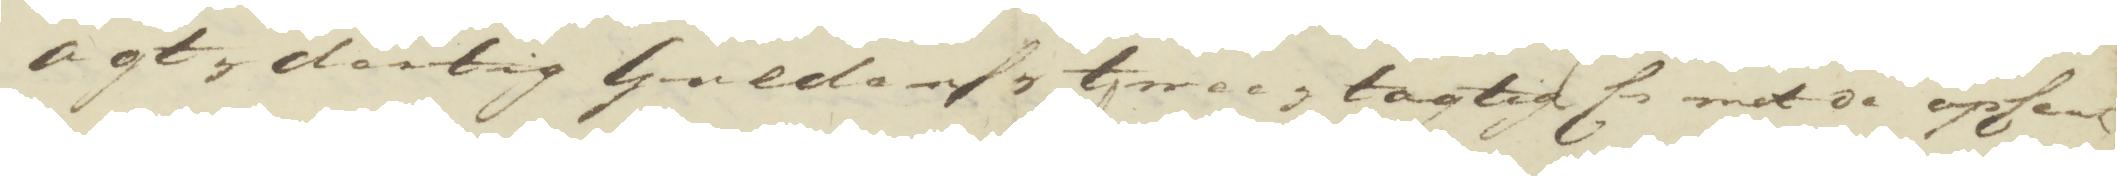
agten dertig Guldens tweegtagtig Cs met de opCent
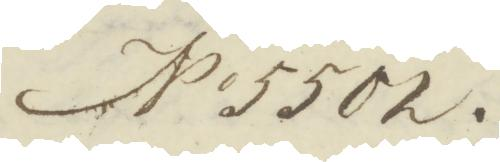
No 5502.
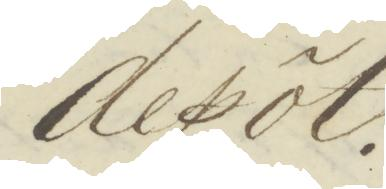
depôt.
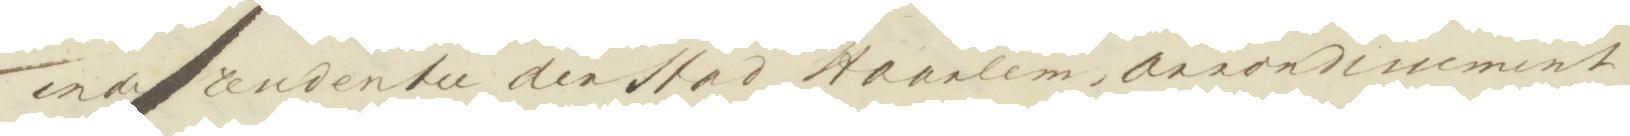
inde residentie der stad Haarlem, arrondissement
